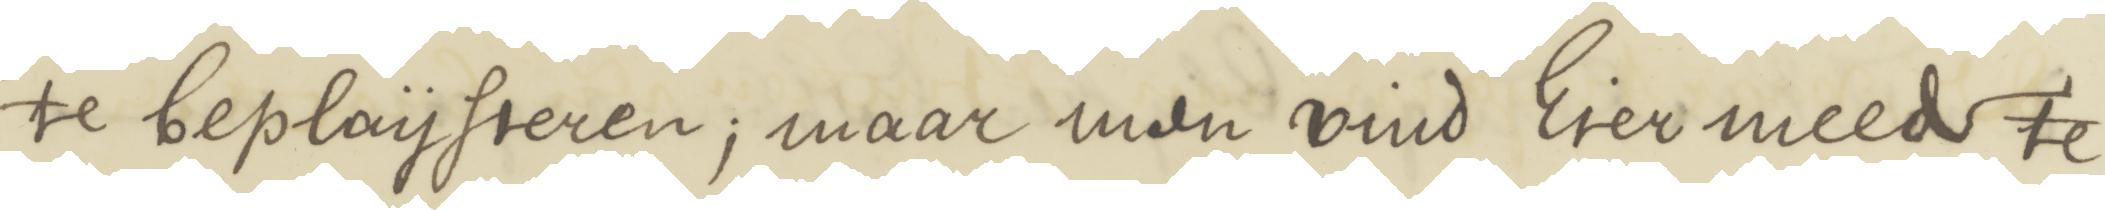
te beplaijsteren; maar men vind hier meede te
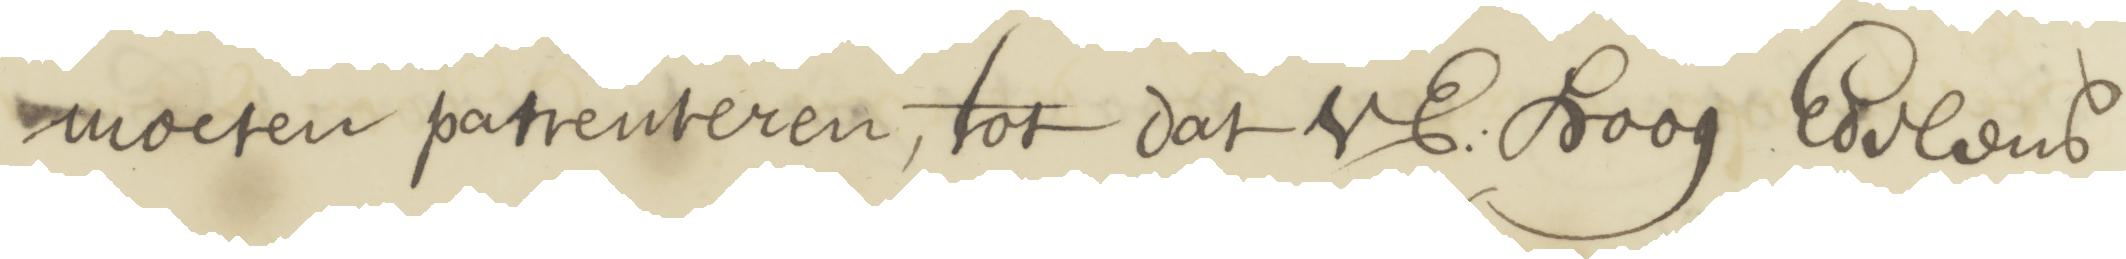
moeten patrenteren, tot dat UE: Hoog Edelens
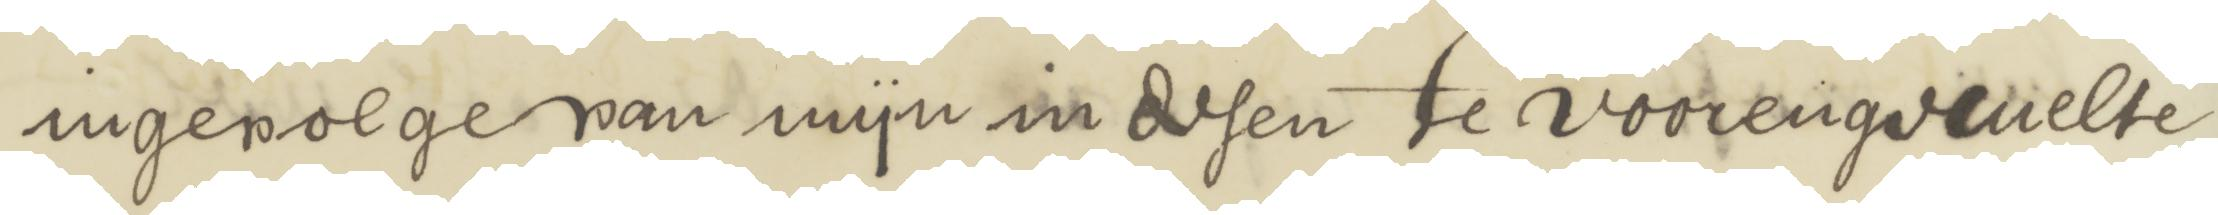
ingevolge van mijn in desen te voorengemelte
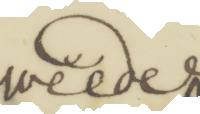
weeder
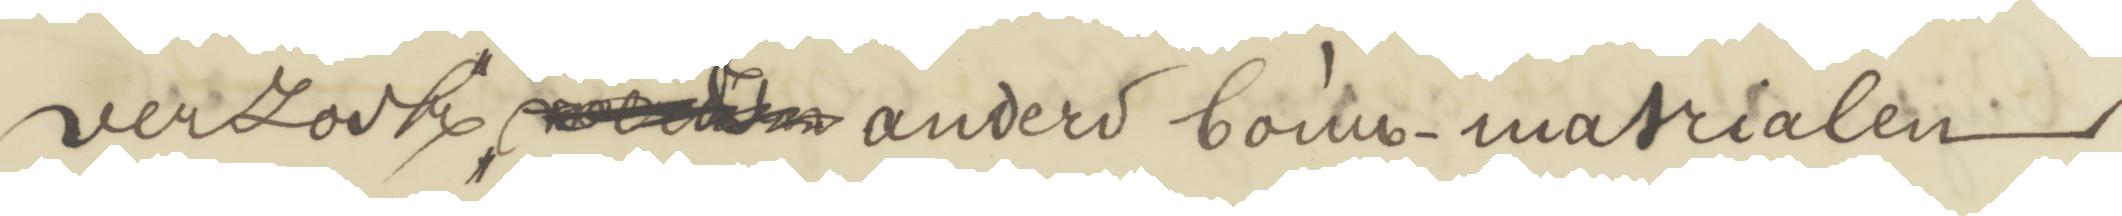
verzoek "„weedxx andere bouw-matrialen
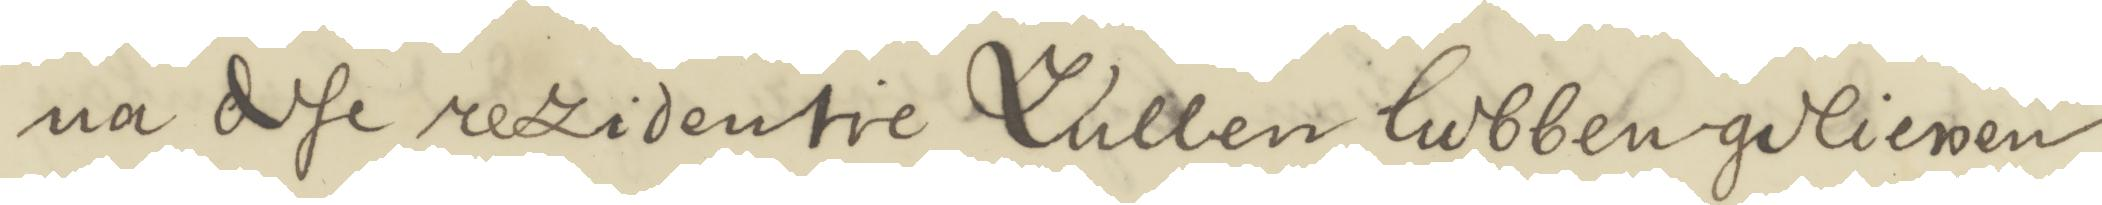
na dese rezidentie zullen hebben gelieven
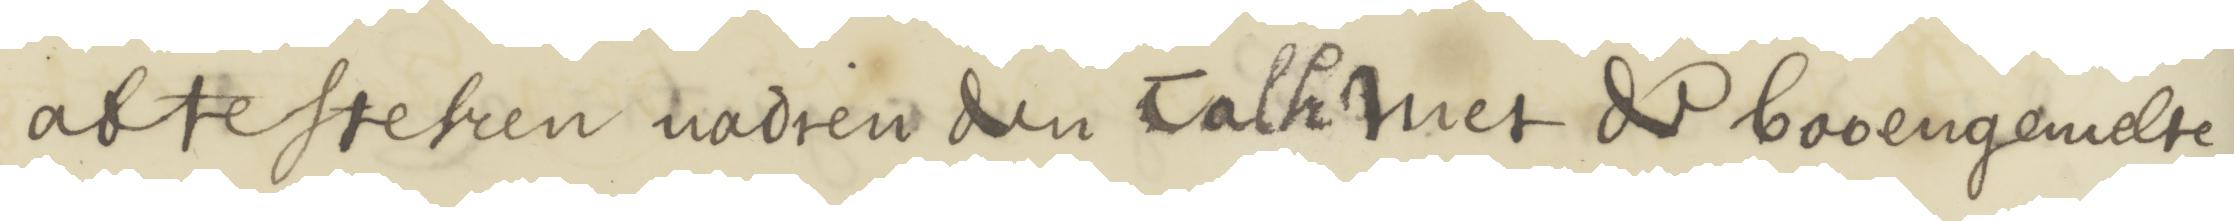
af te steken nadien den calk met de booengemelte
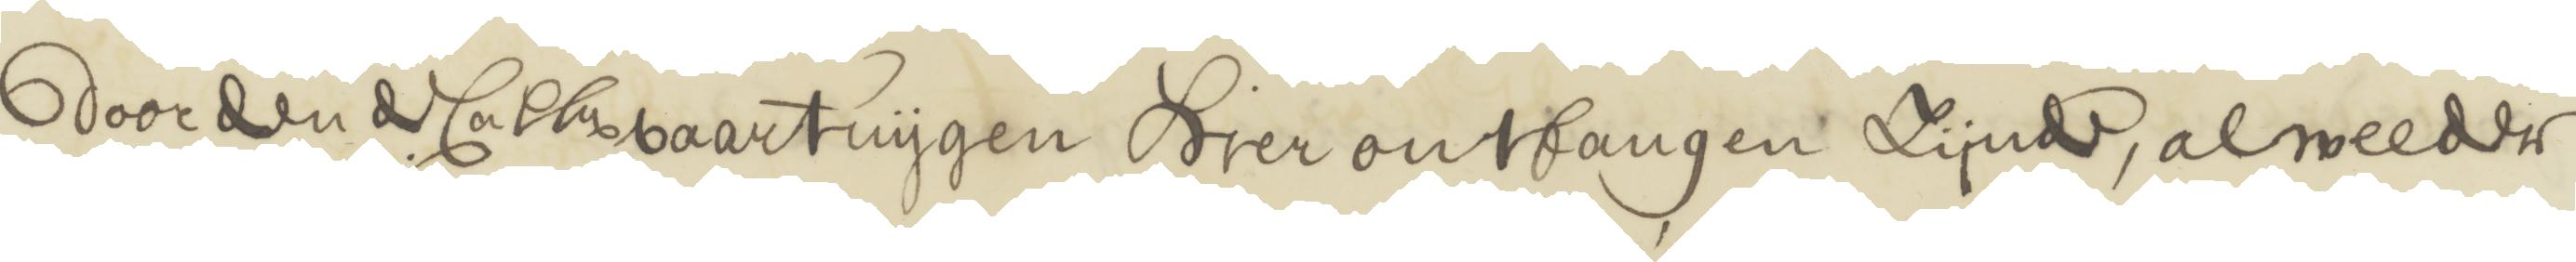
door den de Calk vaartuijgen Hier ontfangen zijnde, alweeder
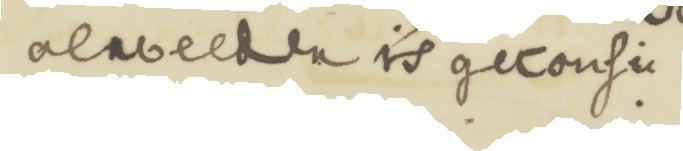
alweeder is geconsu
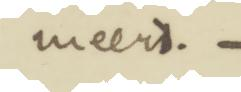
meerd.
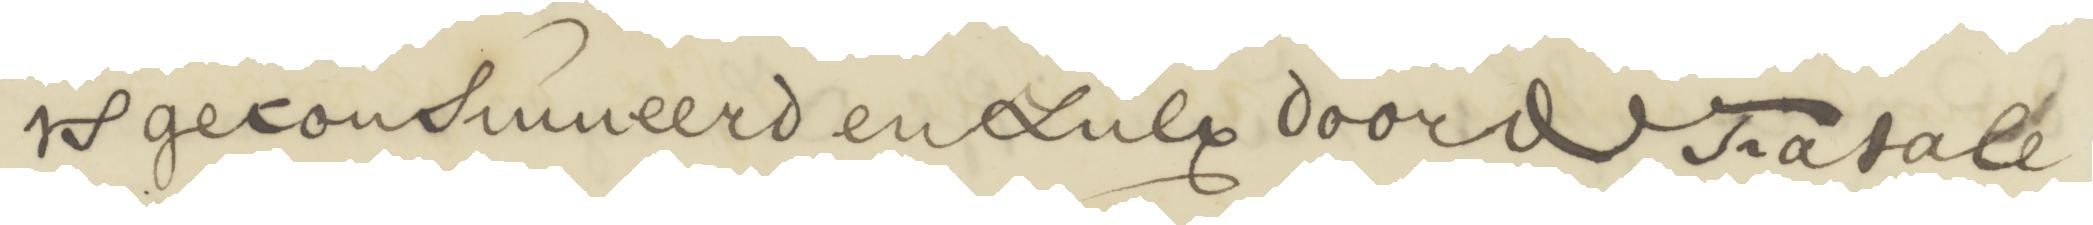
is geconsumeerd en zulx door de Tratale
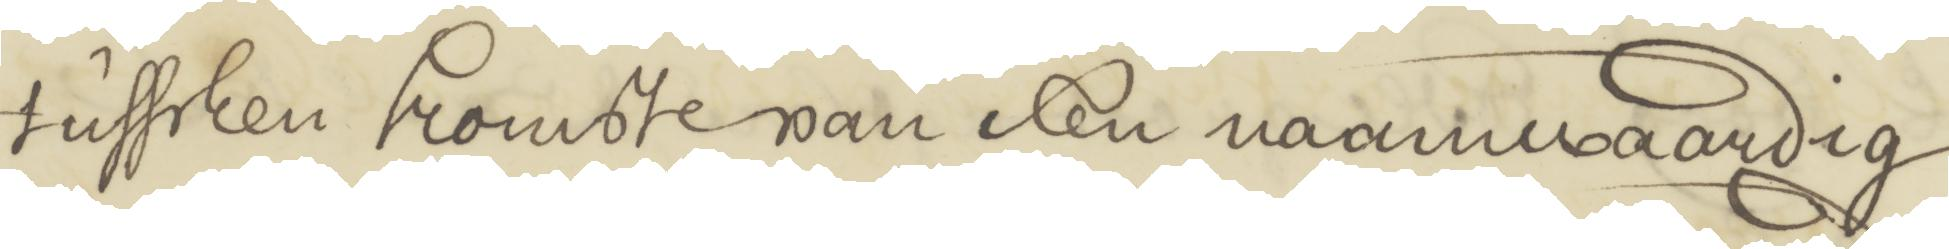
tusschen komste van Een naamwaardig
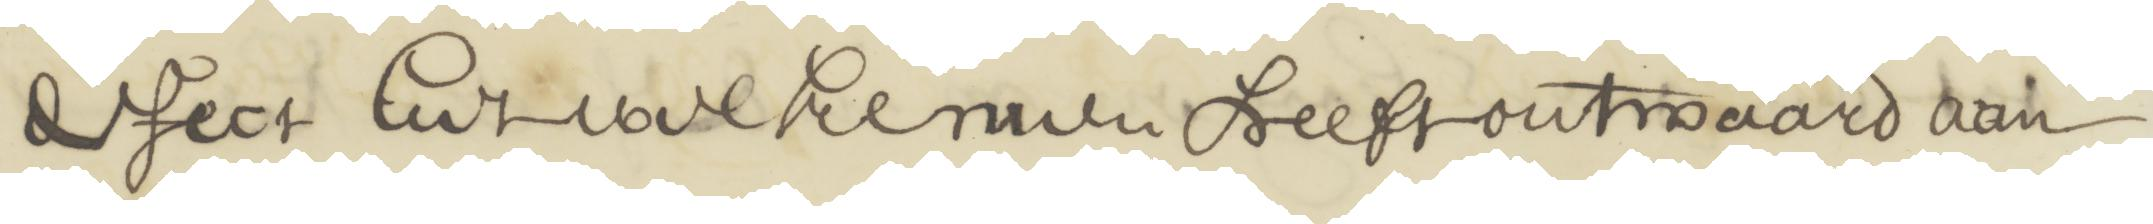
defect het welke men heeft ontwaard aan
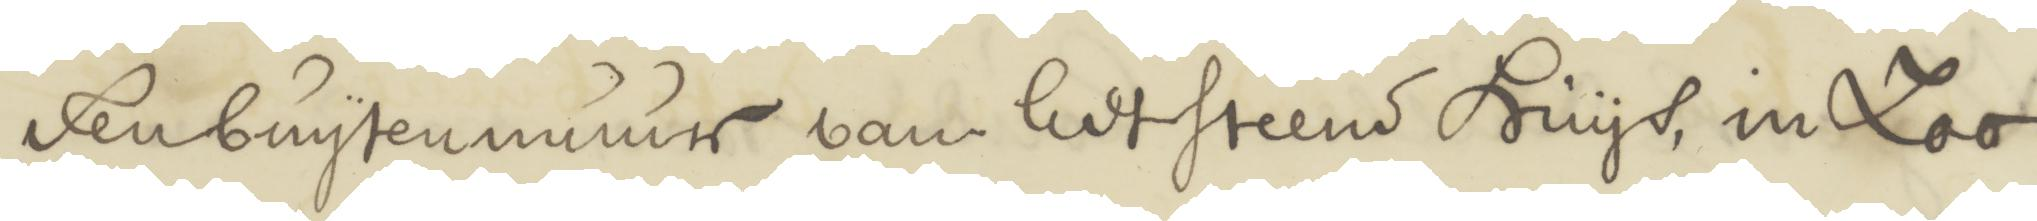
ten buijtenmuur van het steene Huijs, in zoo
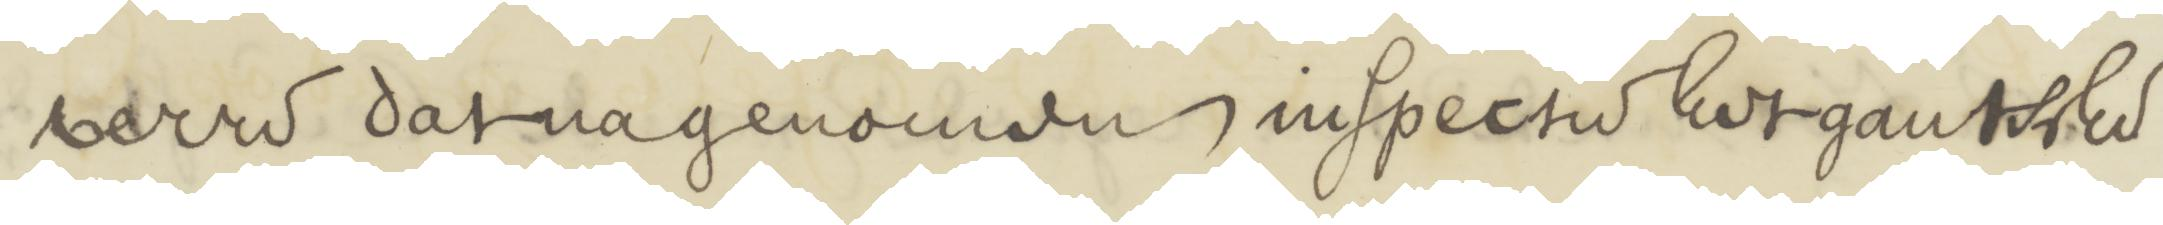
verre dat nagenomen inspectie het gantsche
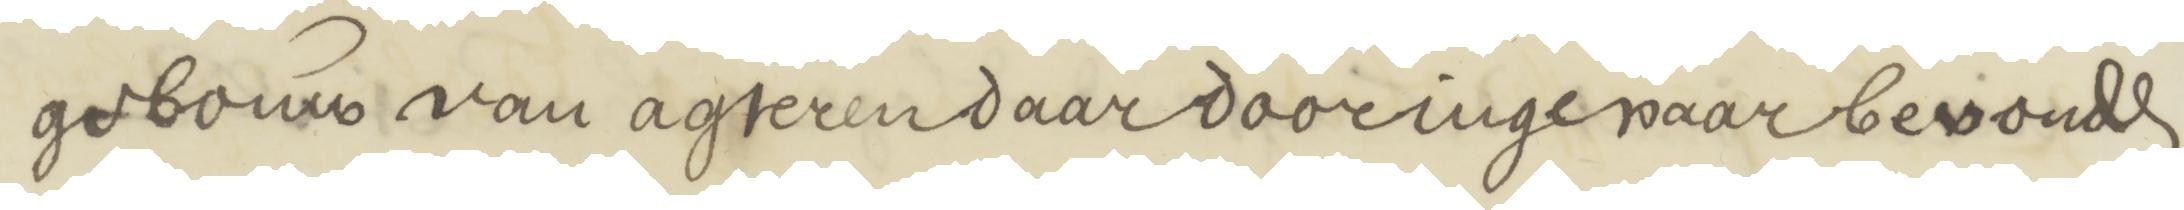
gebouw van agteren daar door ingevaar bevonden
